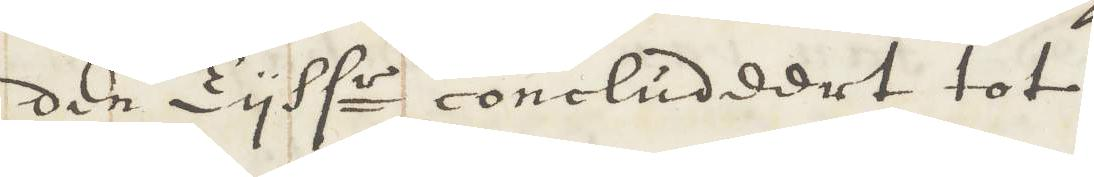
den Eijss=r concludeert tot
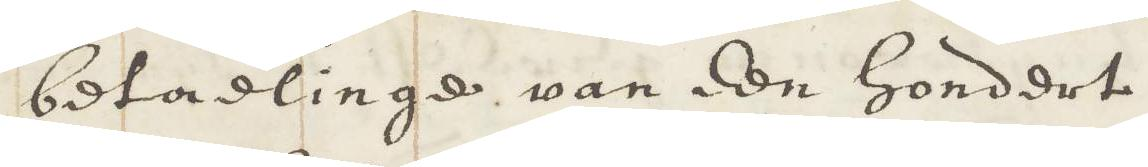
betaelinge van een hondert
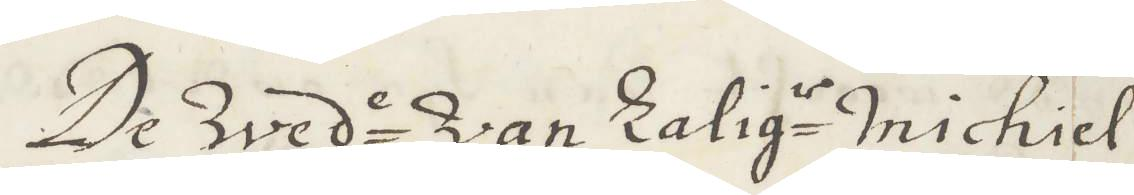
De wed=e van zalig=r michiel
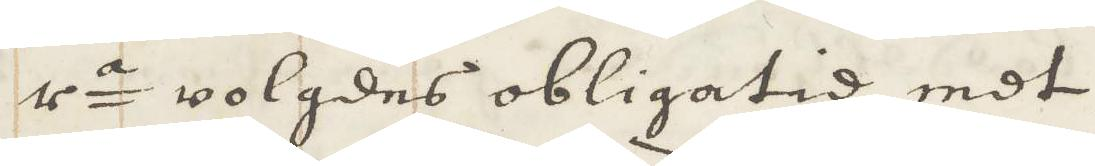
r=a volgens obligatie met
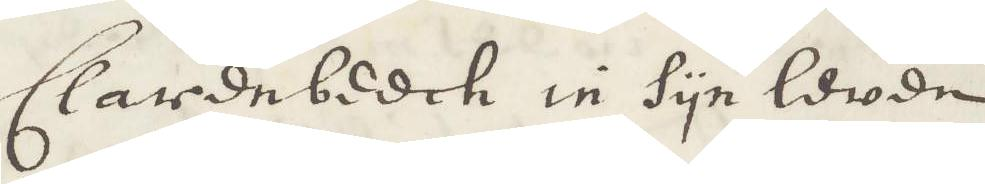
Clarenbeeck in sijn leven
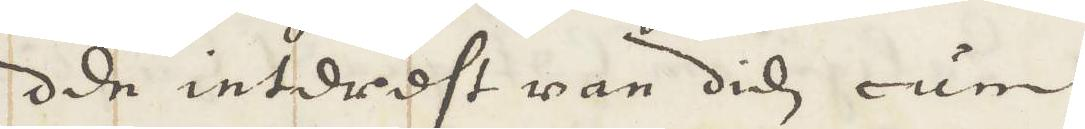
den interest van dien cum
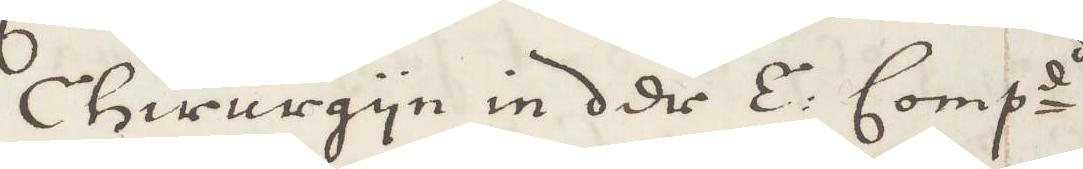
Chirurgijn in der E: Comp=e
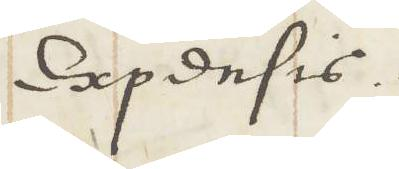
Expensis.
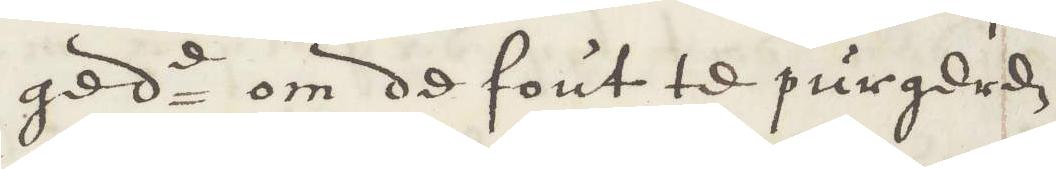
ged=e om de fout te purgeren
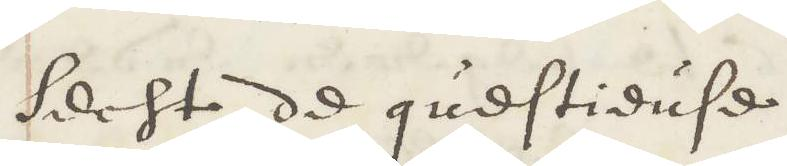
secht de questieuse
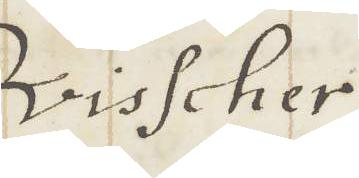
visscher
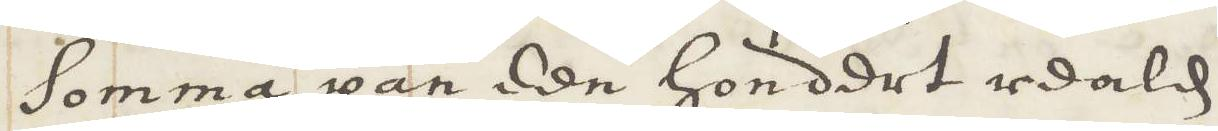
somma van een hondert realen
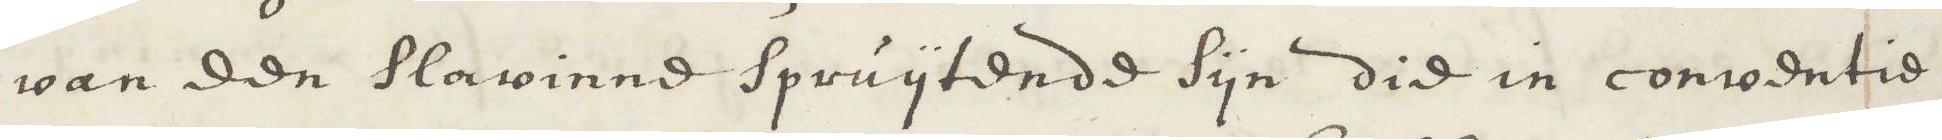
van een slavinne spruijtende sijn die in conventie
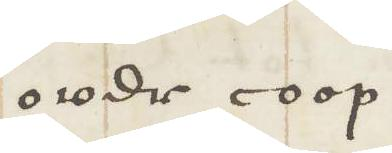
over coop
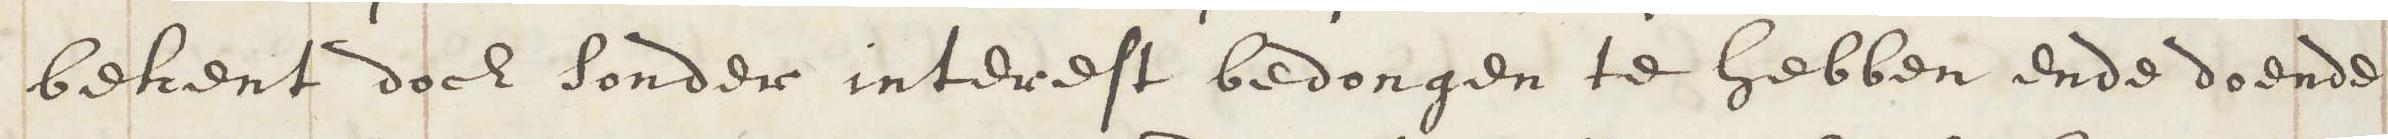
bekent doch sonder interest bedongen te hebben ende doende
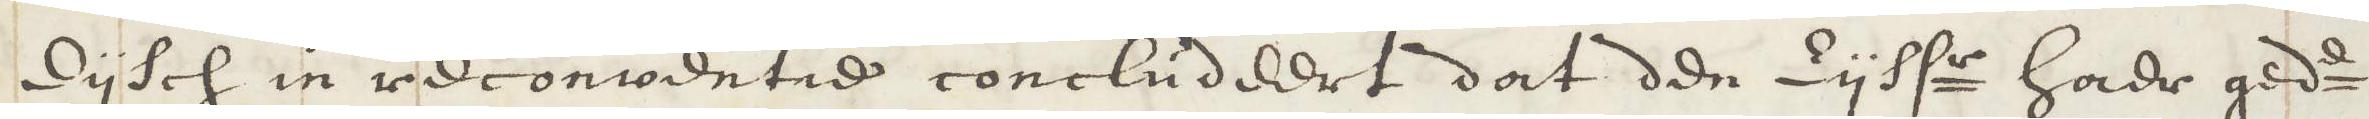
eijsch in reconventie concludeert dat den Eijss=r haer ged=e
